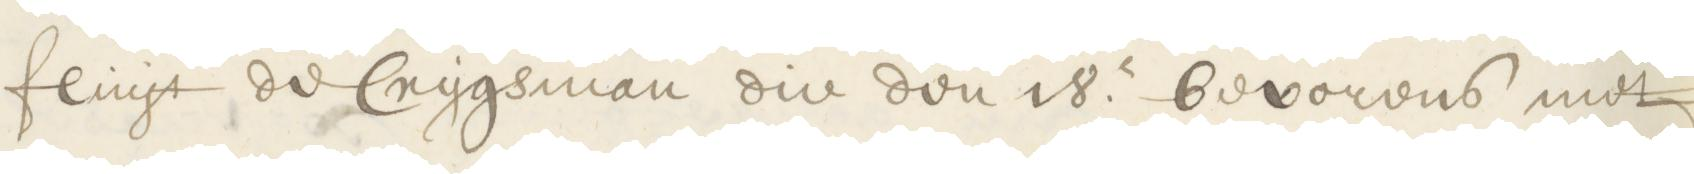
fluijt de Crijgsman die den 18.e bevorens met
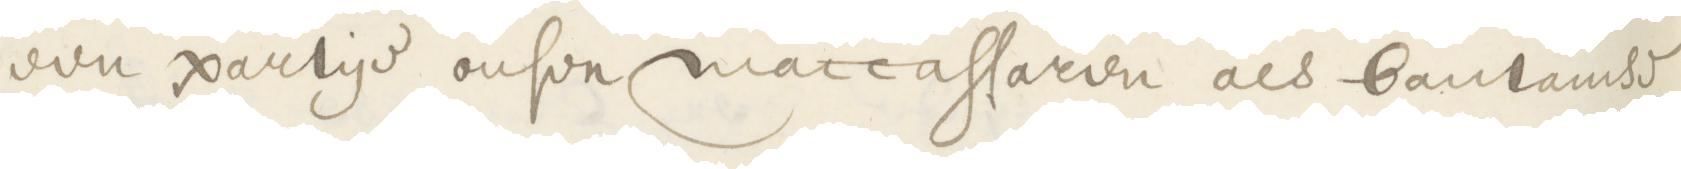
een partije onser maccassaren als bantamse
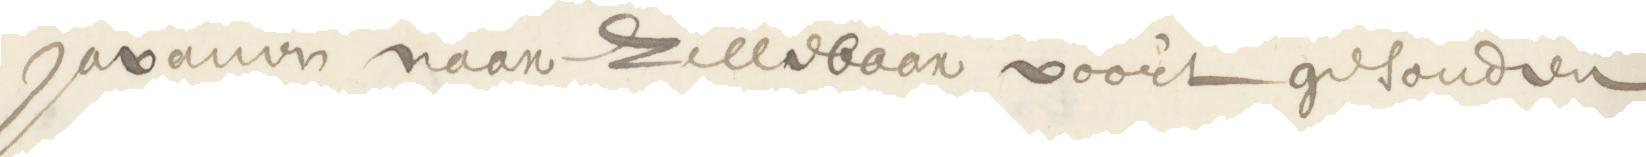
javanen naar Zillebaar voor't gesonden
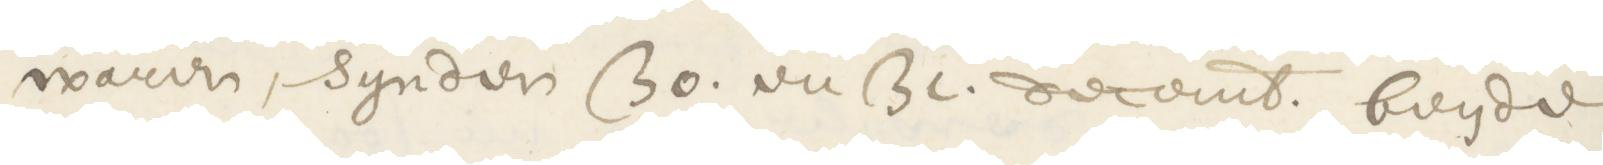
waren, synden 30. en 31. december. beijde
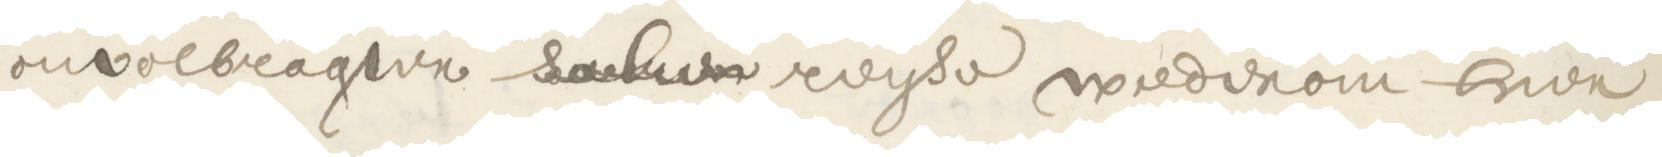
onvolbragter saeken reijse wederom hier
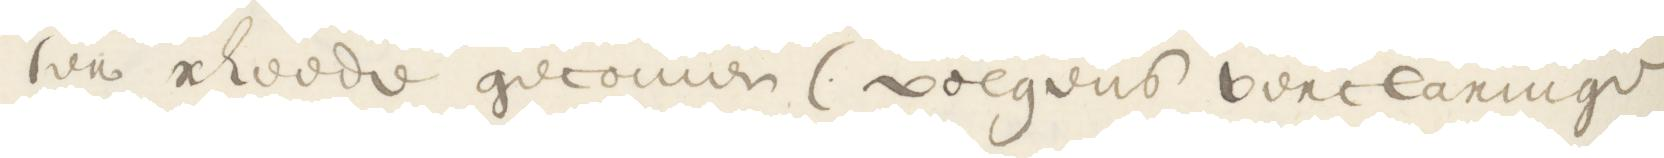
ter rheede gecomen (.volgens verclaringe
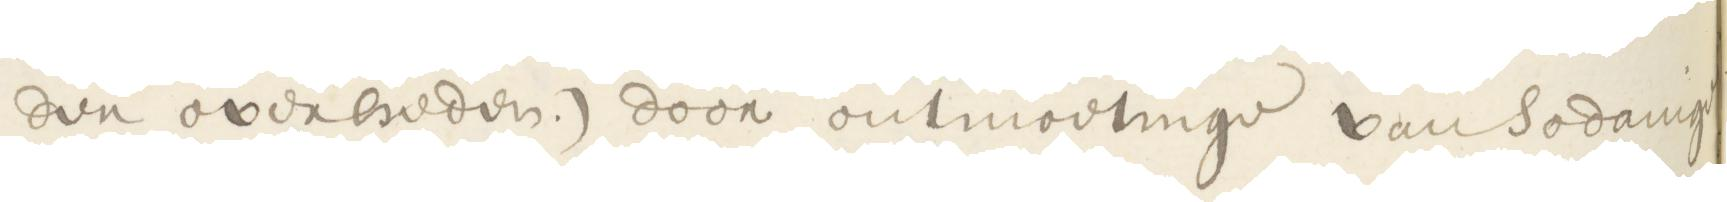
den overheden.) door ontmoetinge van sodanige
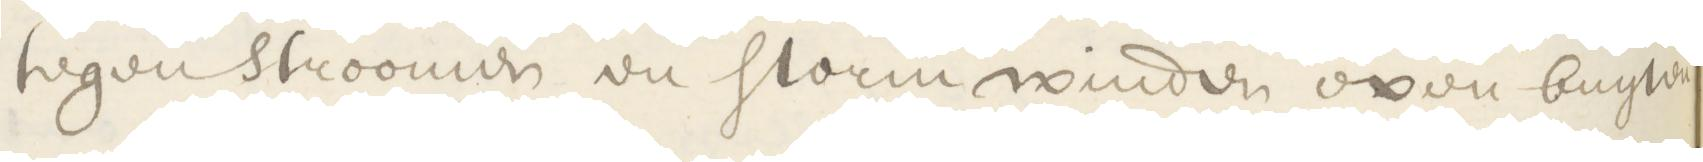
tegenstroomen en storm winden even buijten
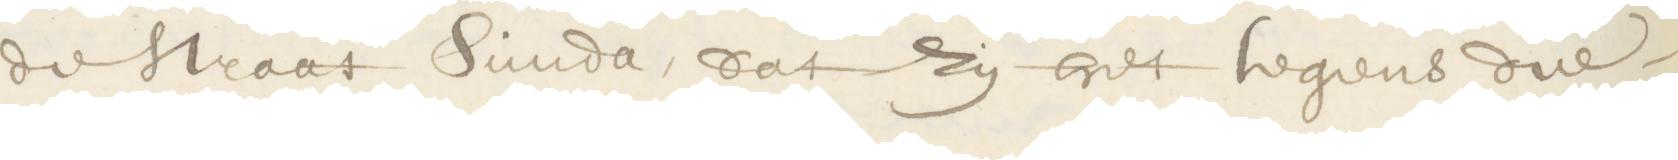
de straat Sunda, dat zij het tegens die
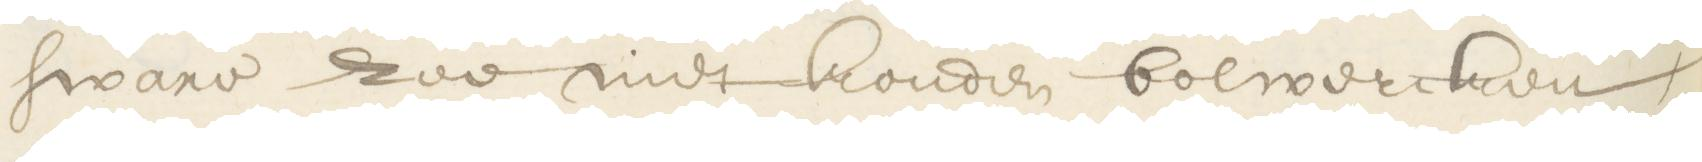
sware zee niet konden bolwercken
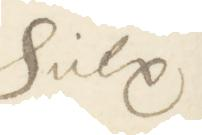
sulx
